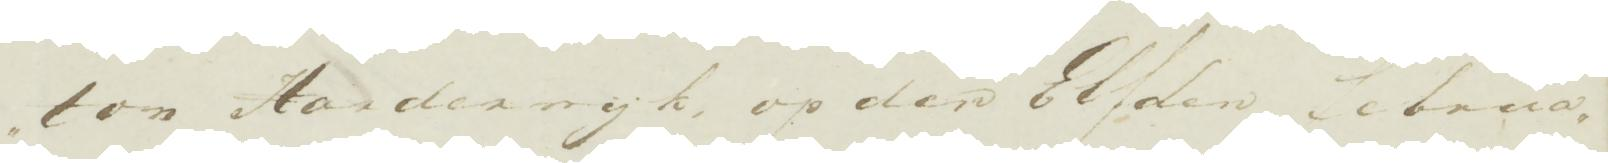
ten Harderwijk, op den Elfden Februa„
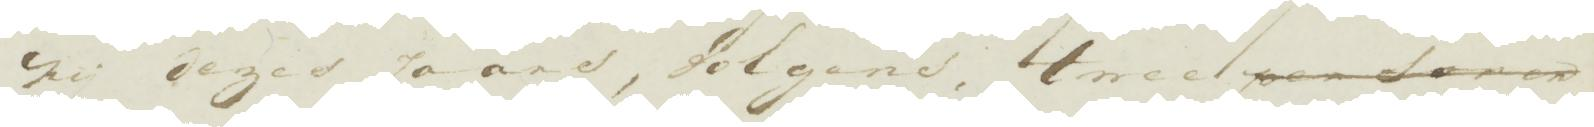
ri dezes Jaars, volgens, twee per sonen
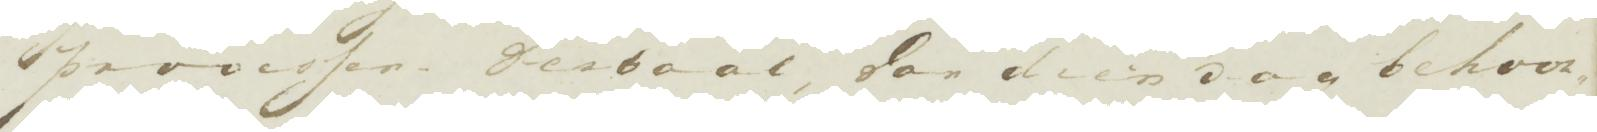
processen verbaal, Van dien dag behoor„
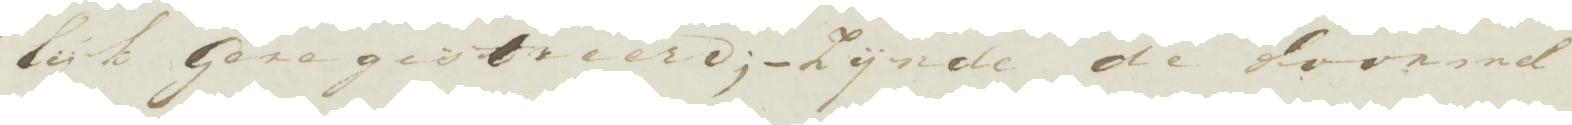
lijk Geregistreerd;- Zijnde de Voormel
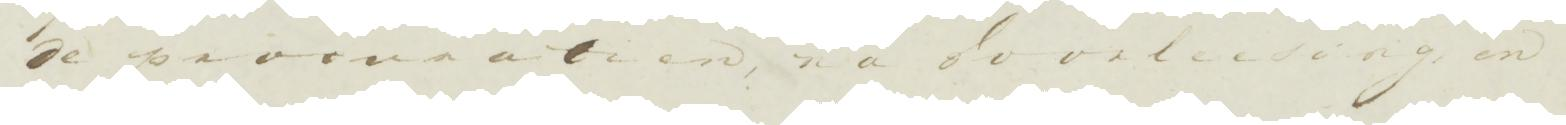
de procucatien, na voorleesing, en
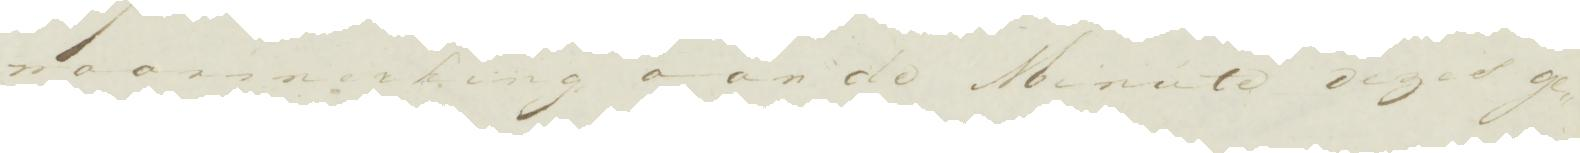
waarmerking aan de Minute dezes ge„
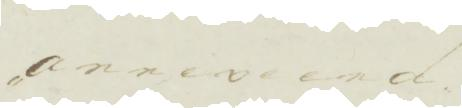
„annexeerd.
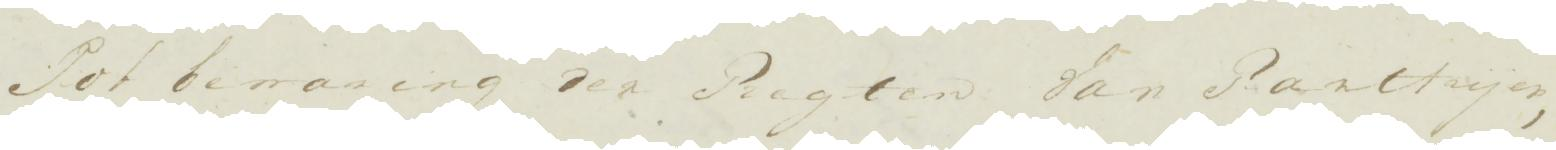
Tot bewaring der Regten, Van Parthijen,
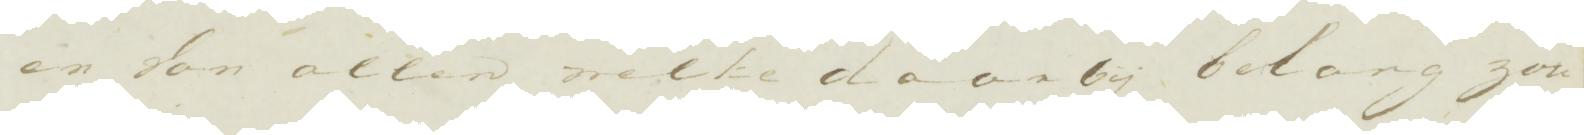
en van allen welke daar bij belang zou
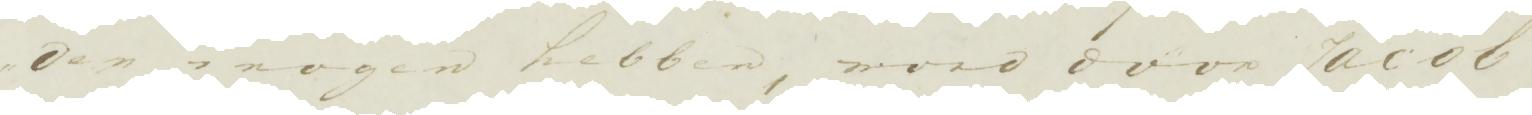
den mogen hebben, word door Jacob
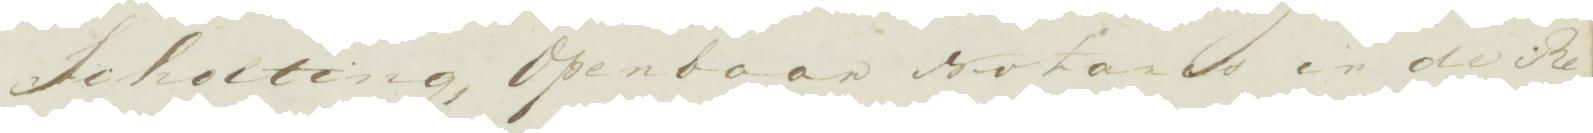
Scholting, Openbaar Notaris in de Re
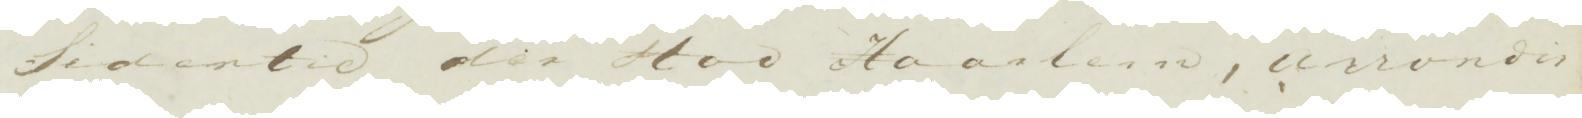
sidentie der stad Haarlem, arrondis
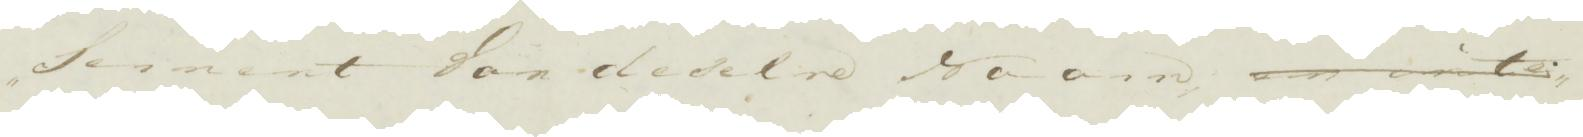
sement Van deselve naam, en in te„
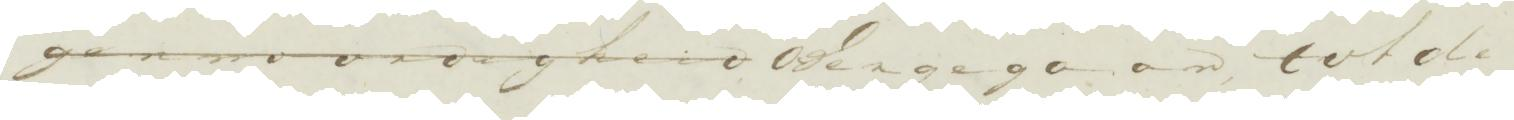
genwoordigheid overgegaan, tot de
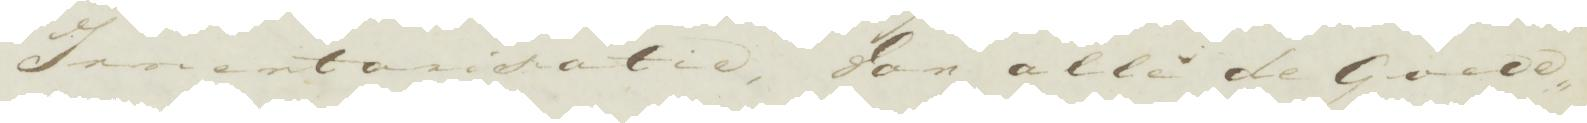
Inventarisatie, Van alle de Goede„
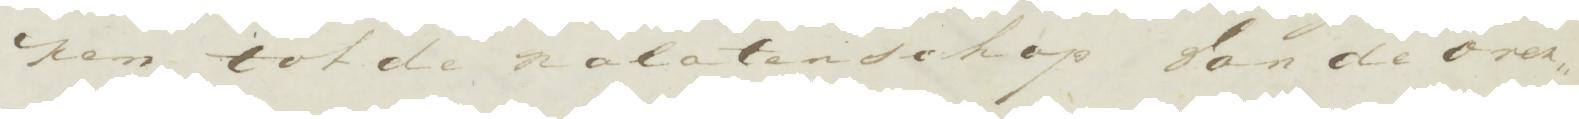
ren, tot de nalatenschap van de over„
